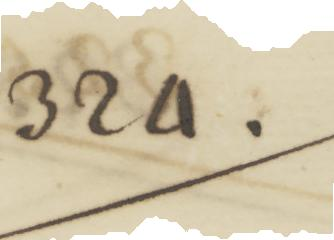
324.
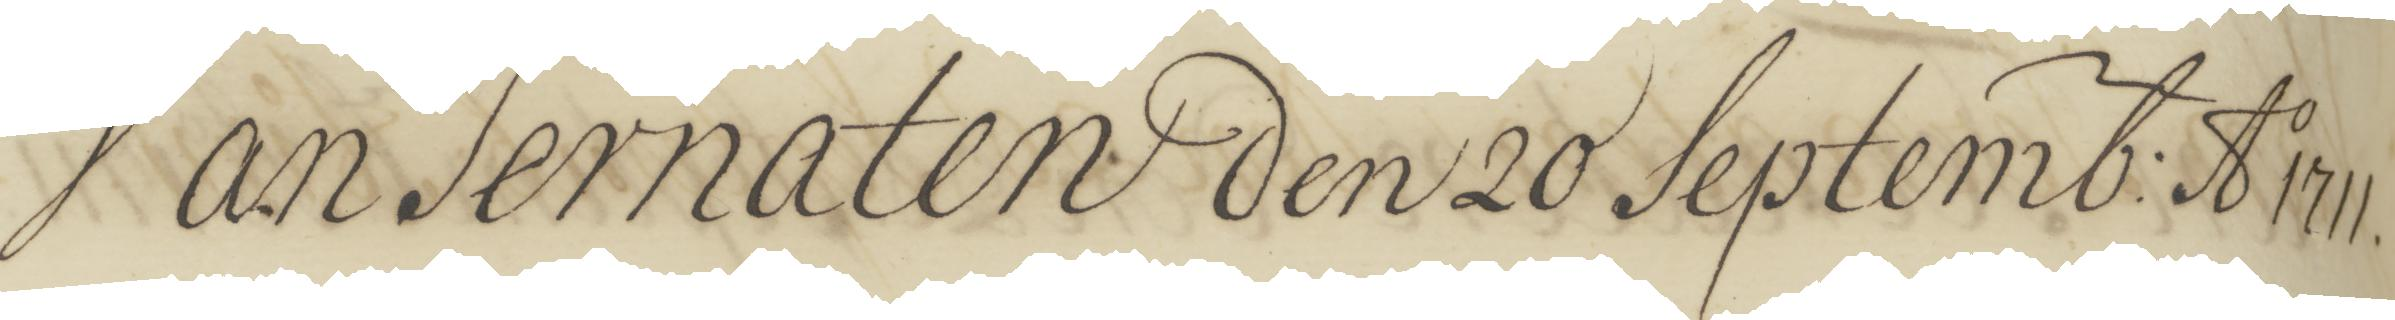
Van Ternaten den 20 Septemb: Ao 1711.
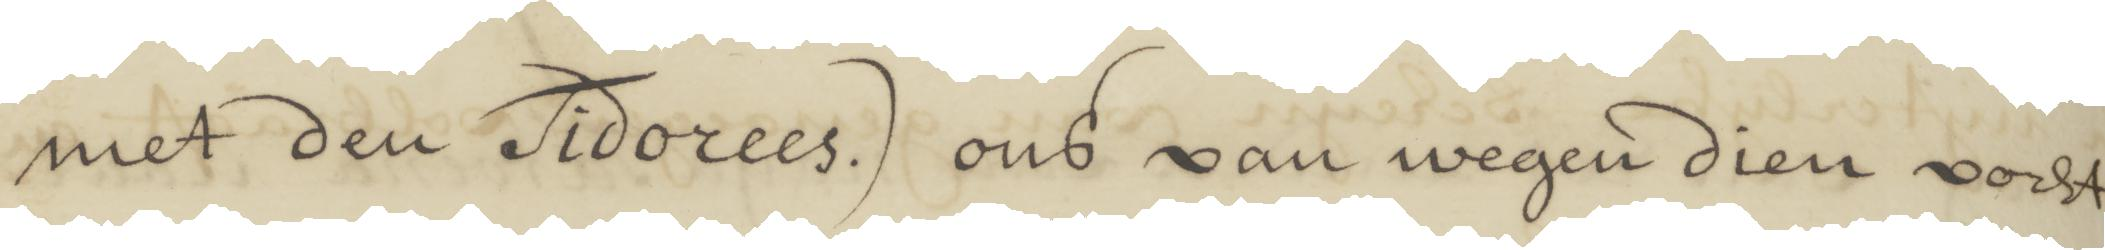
met den Tidorees.) ons van wegen dien vorst
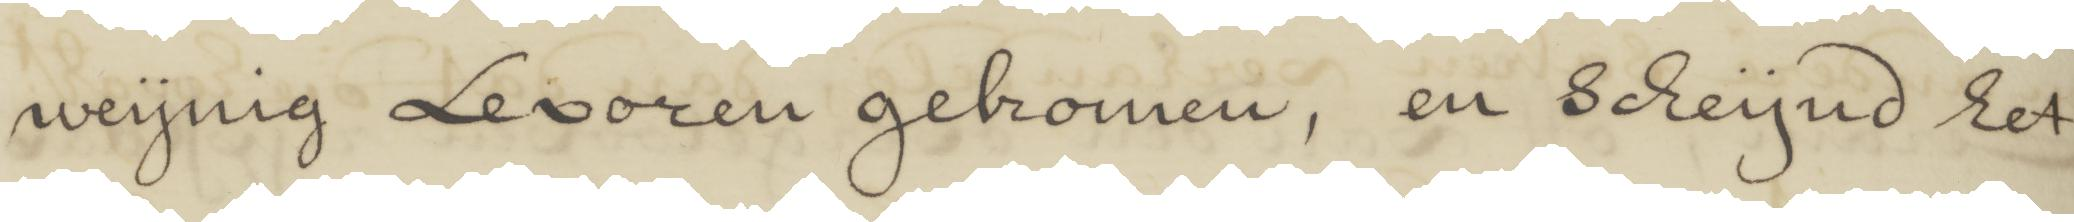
weijnig tevoren gekomen, en scheijnd het
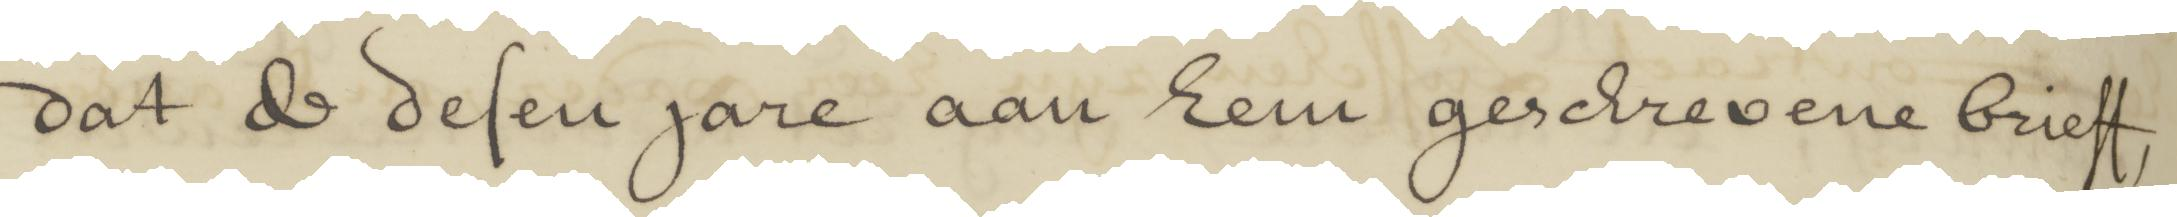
dat de desen jare aan hem geschrevene brieff
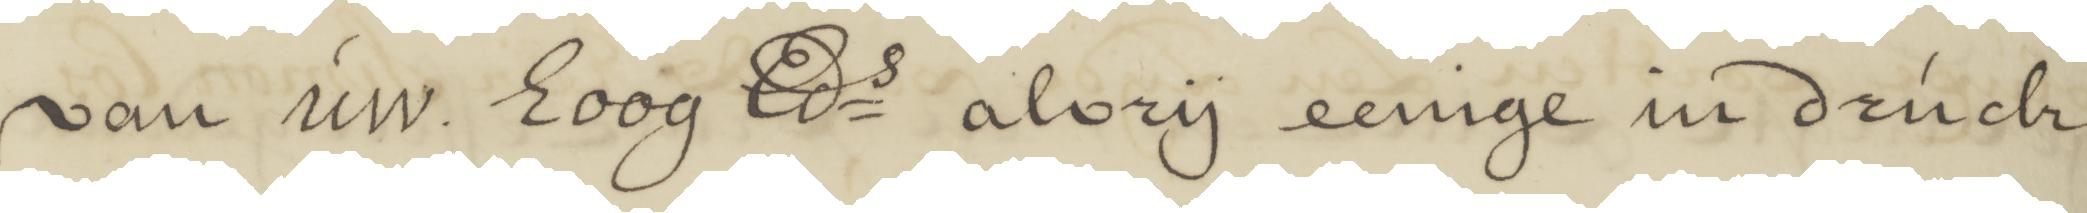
van uw: hoog Ed=s alvrij eenige in druck
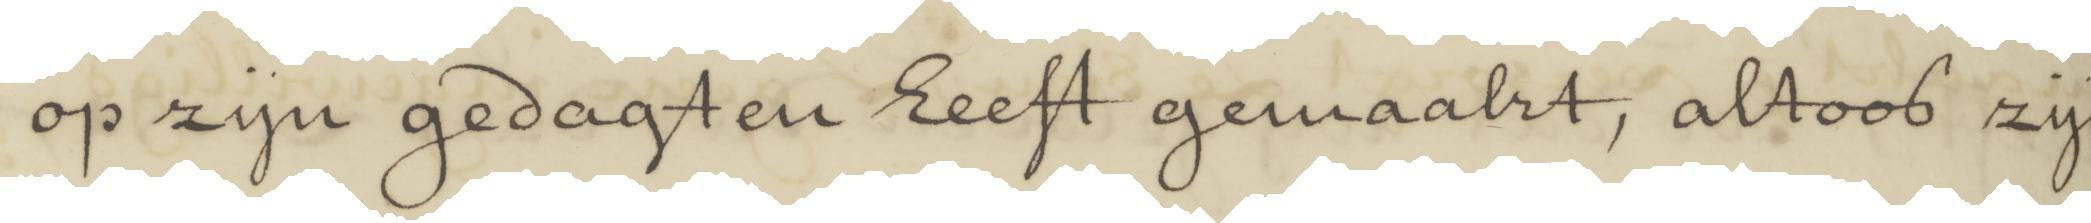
op zijn gedagten heeft gemaakt; altoos zijn
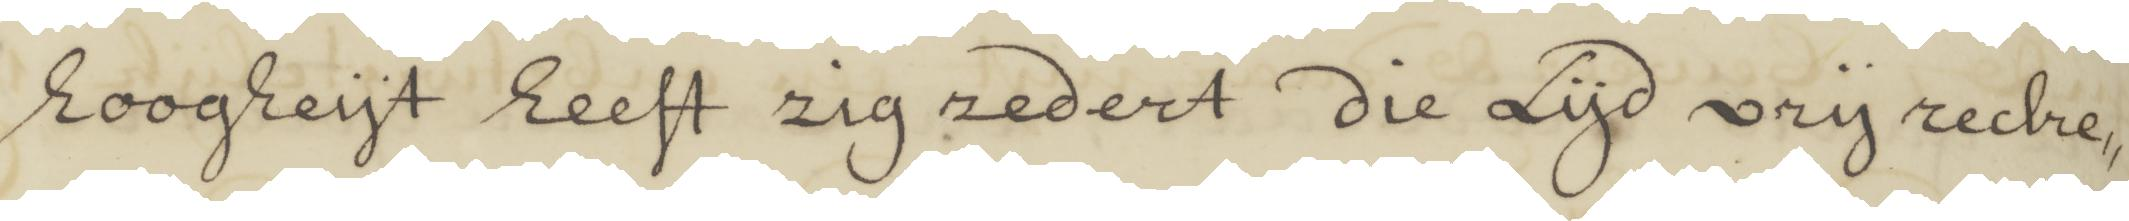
hoogheijt heeft zig zedert die tijd vrij recke„
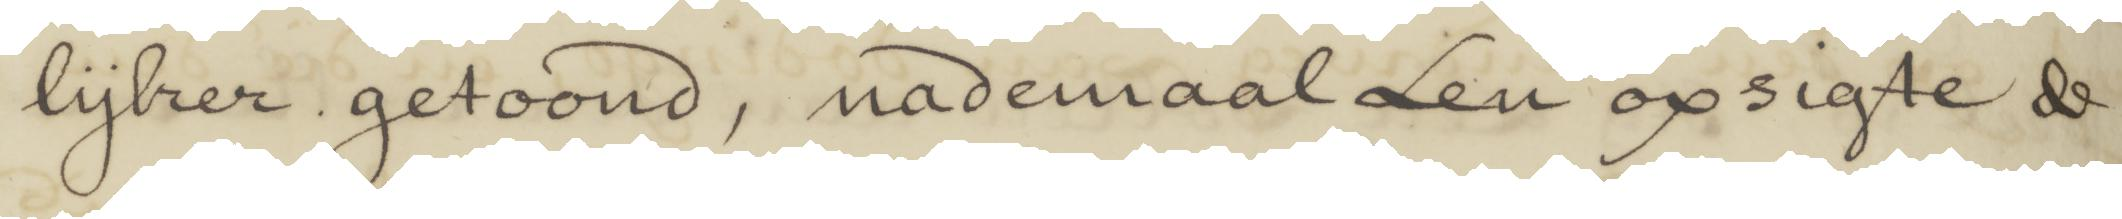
lijker getoond, nademaal ten opsigte de
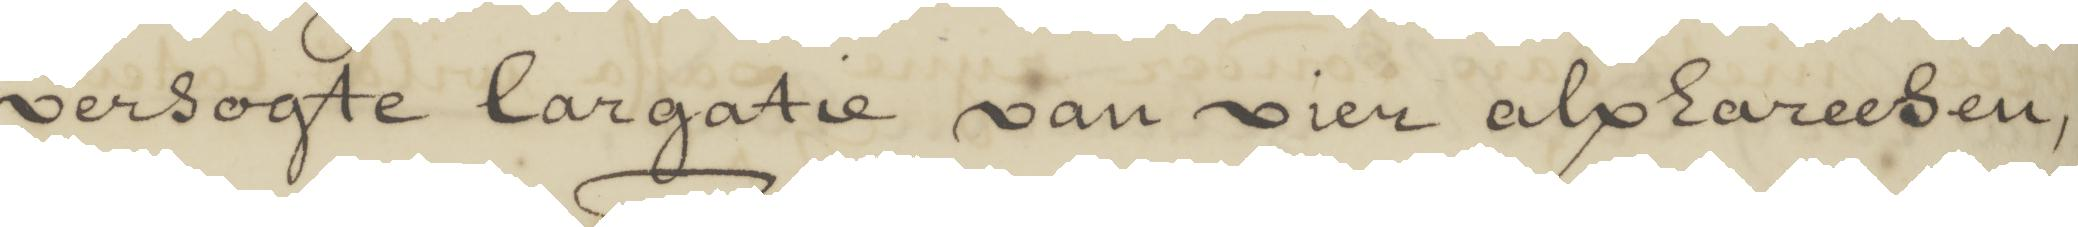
versogte largatie van vier alphareesen,
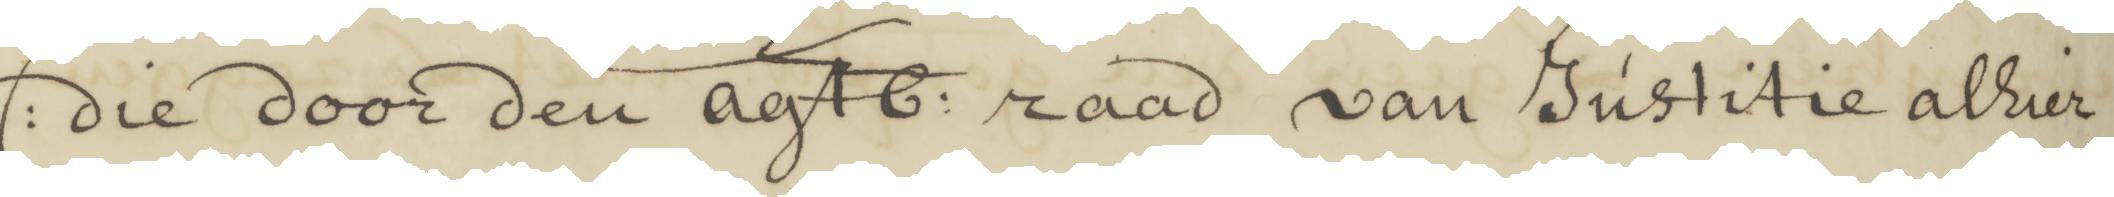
(:die door den agtb: raad van Iustitie alhier
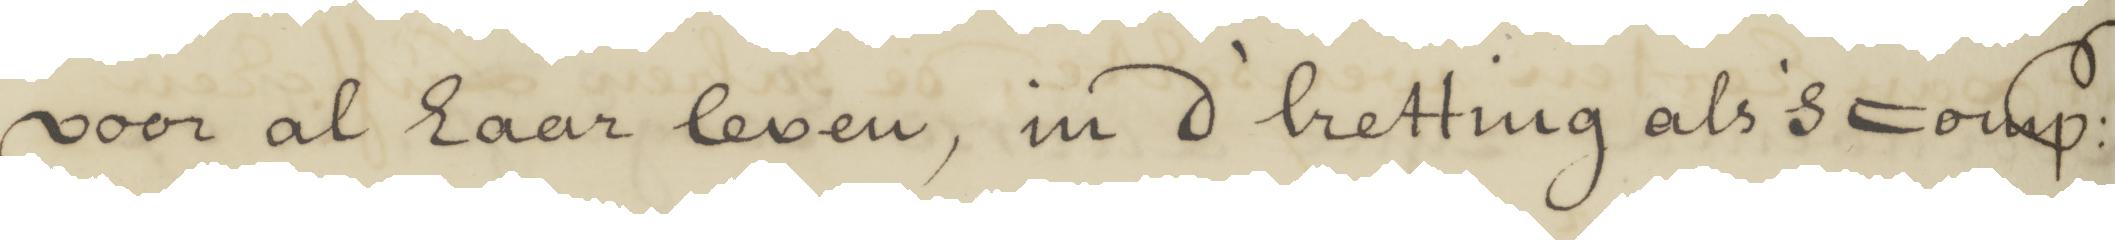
voor al haar leven, in d’ ketting als ’s Comp:s
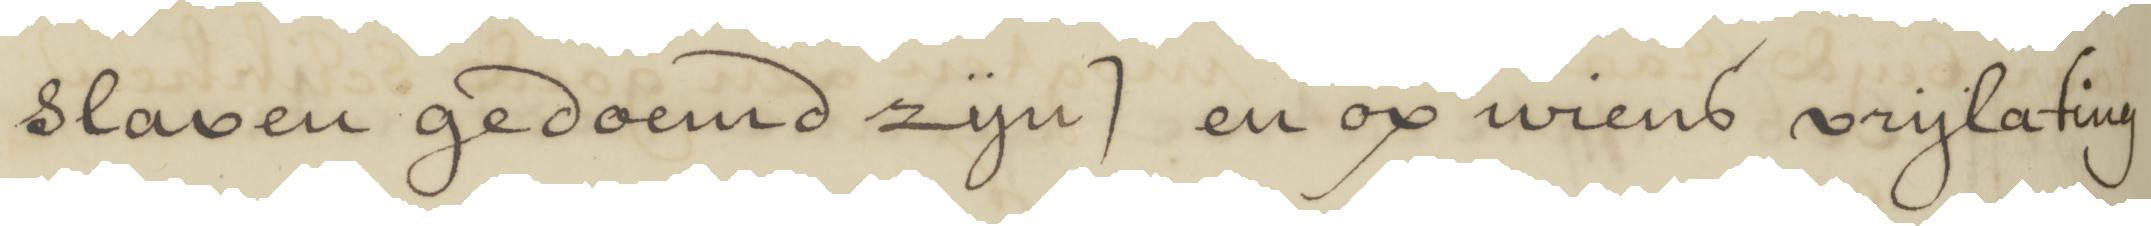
slaven gedoemd zijn) en op wiens vrijlating
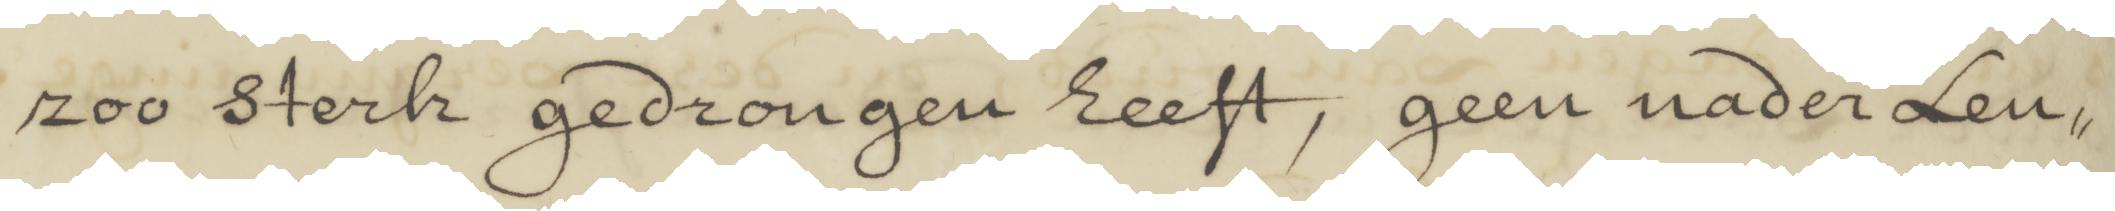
zoo sterk gedrongen heeft, geen nader ten„
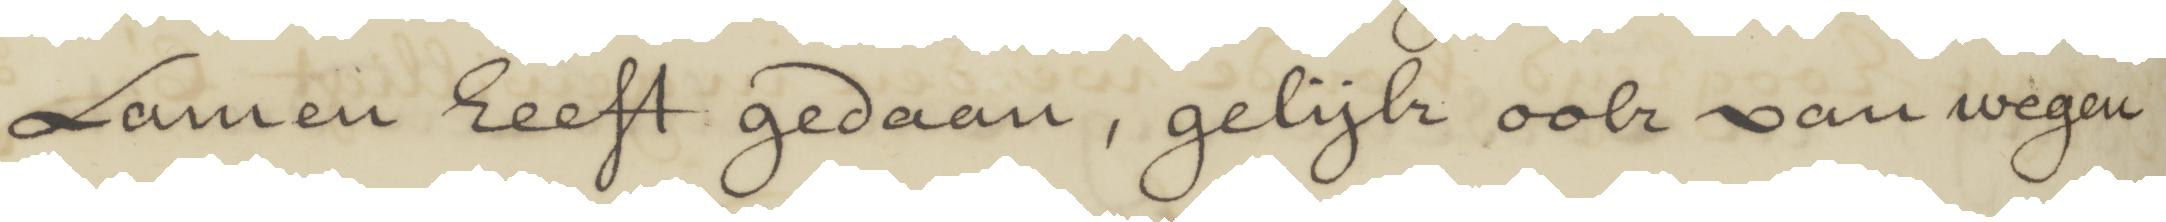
tamen heeft gedaan, gelijk ook van wegen
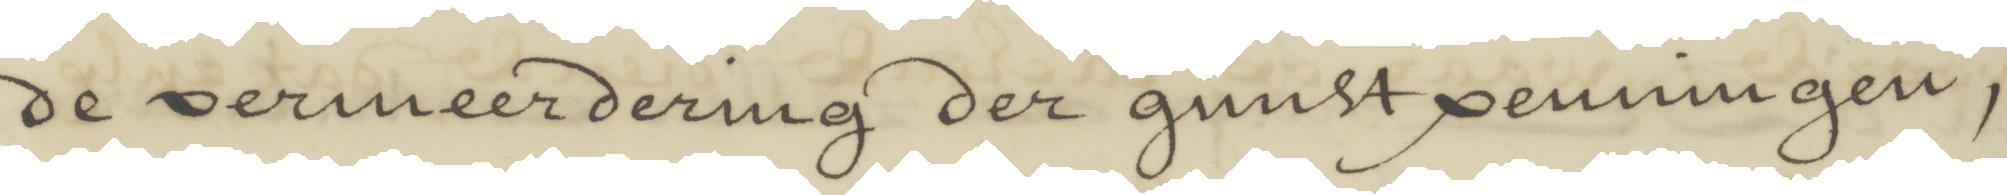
de vermeerdering der gunst penningen,
